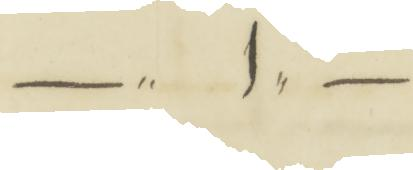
—„ 1„ —
